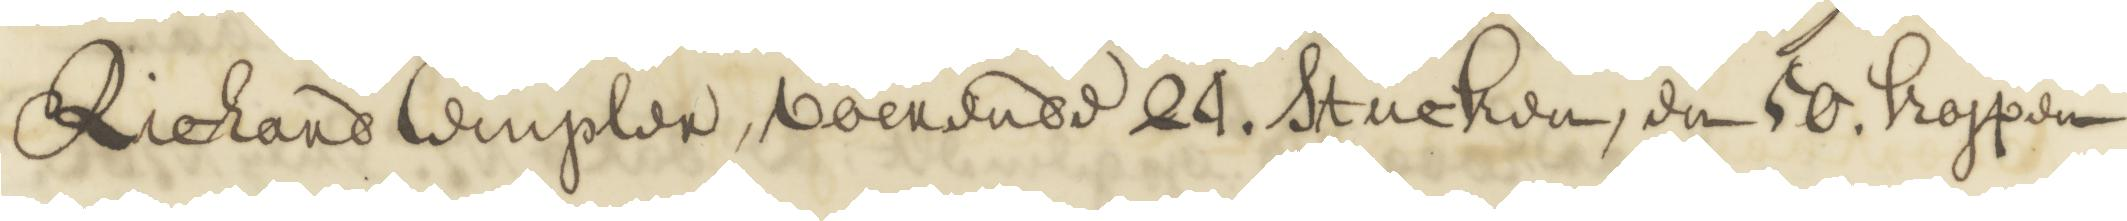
Richard templer, voerende 24. stucken, en 50. koppen
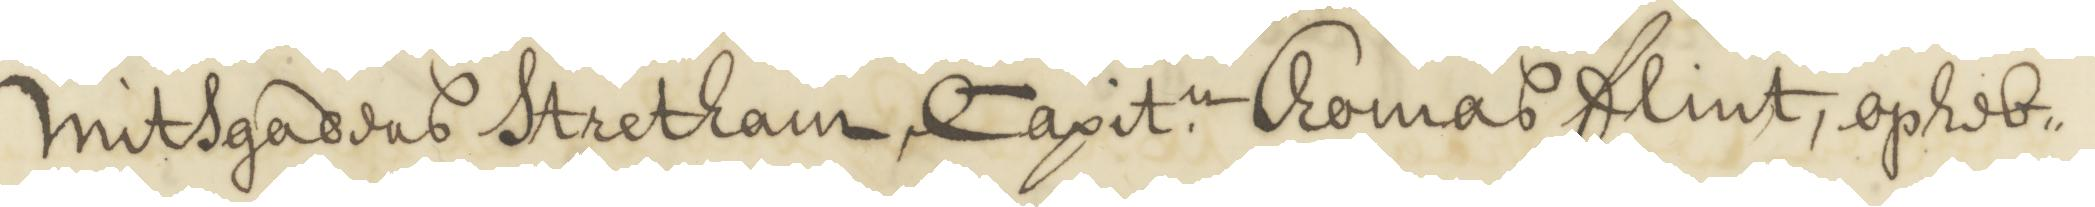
mitsgaders stretham, Capit:n thomas flint, opheb„
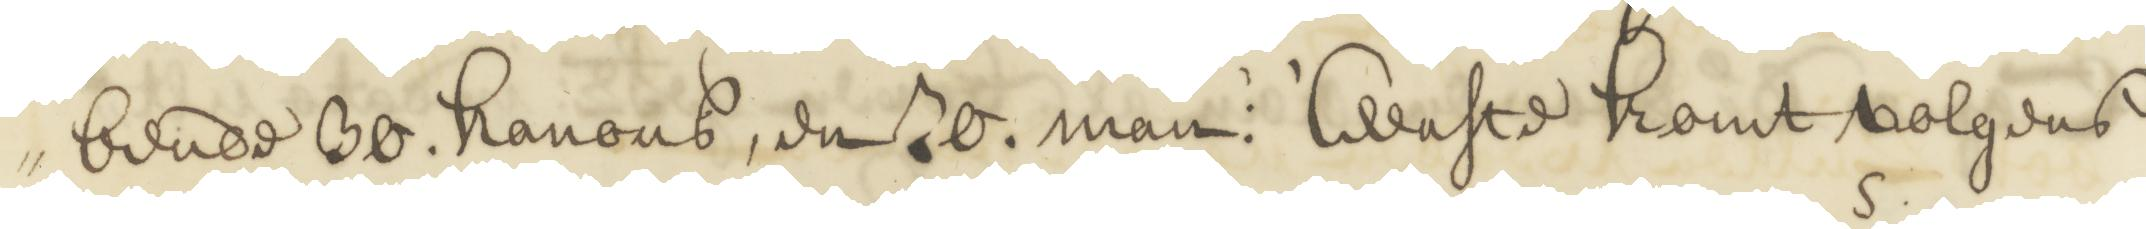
„bende 30. kanons, en 20. man: 'teerste komt volgens
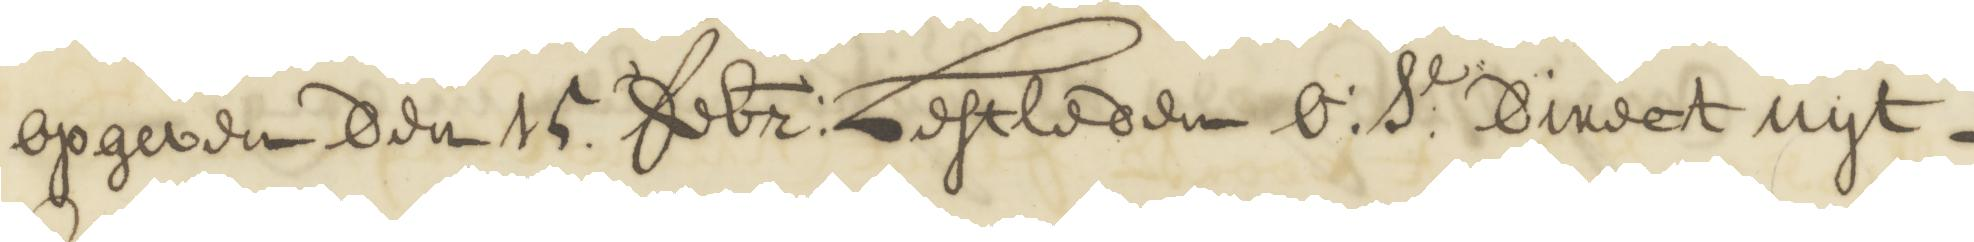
opgeven den 15. febr: Lestleden O: s:e direct uijt
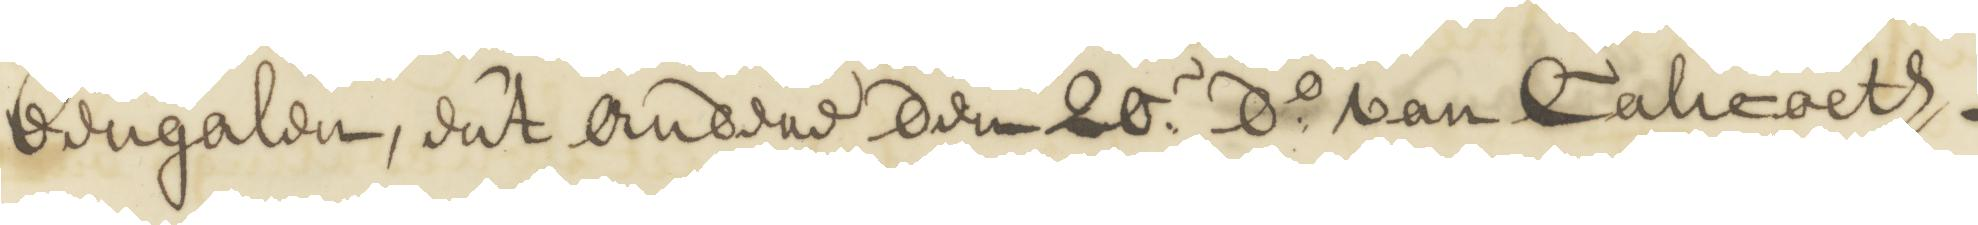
bengalen, en’t andere den 20:e d:o van Calicoeth
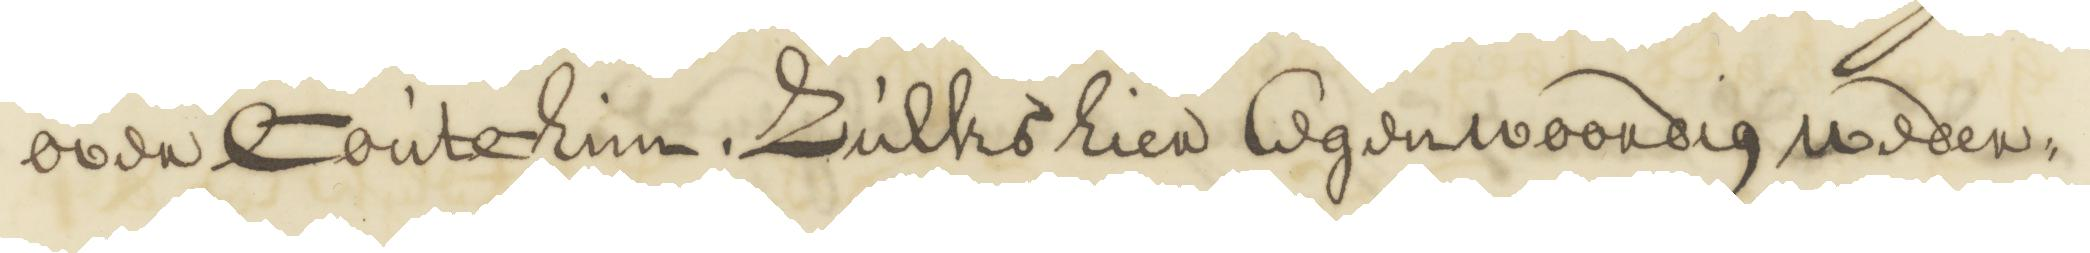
over Coutchim. Zulks hier tegenwoordig weder„
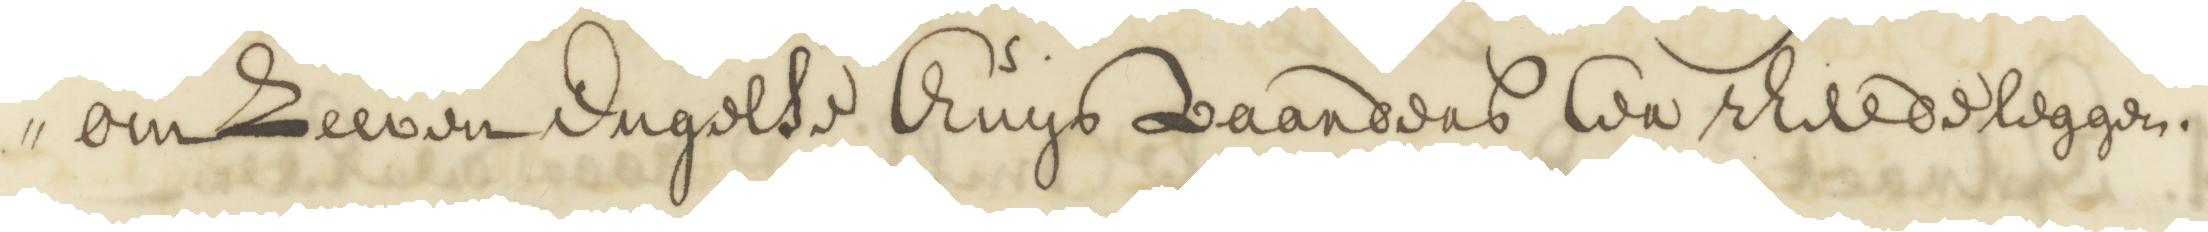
„ om zeeven Engelse thuijs vaarders ter rheede leggen.
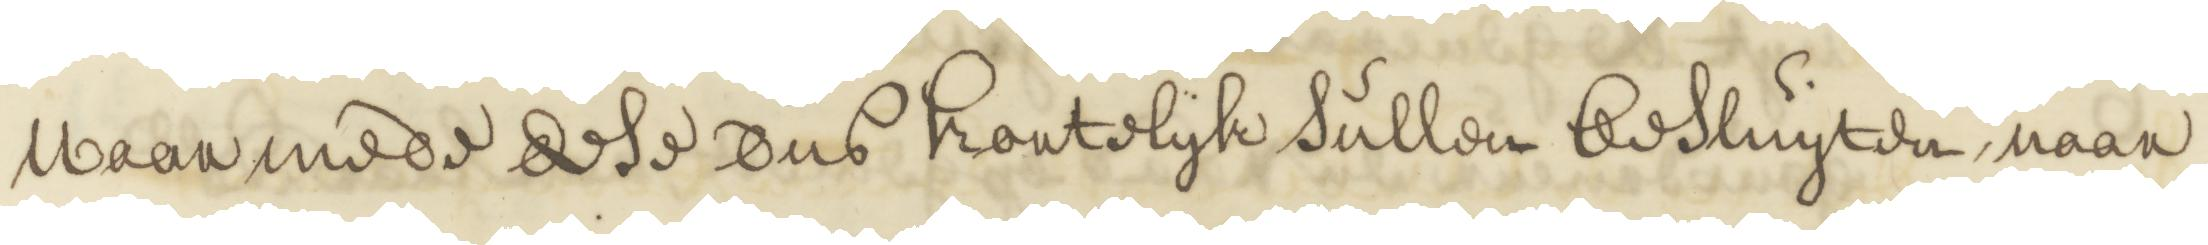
waar mede dese dus kortelijk sullen besluijten, naar
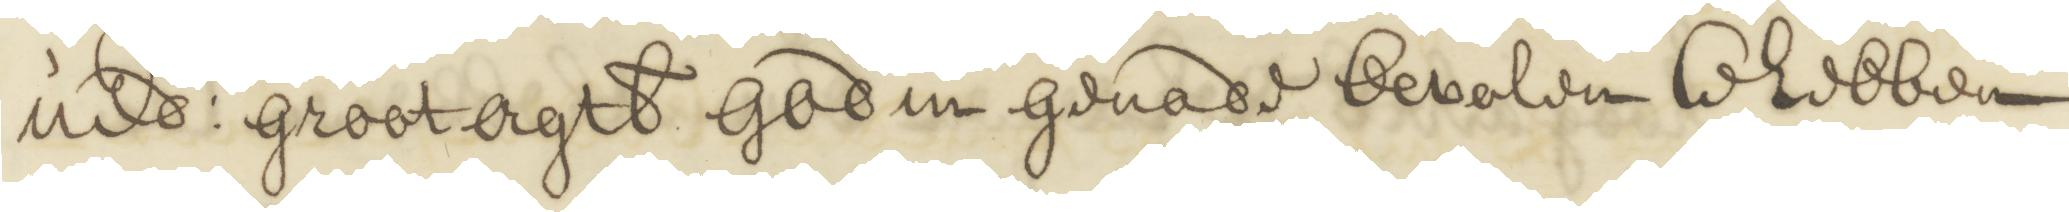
uEd:ele groot agtb god in genade bevolen te hebben
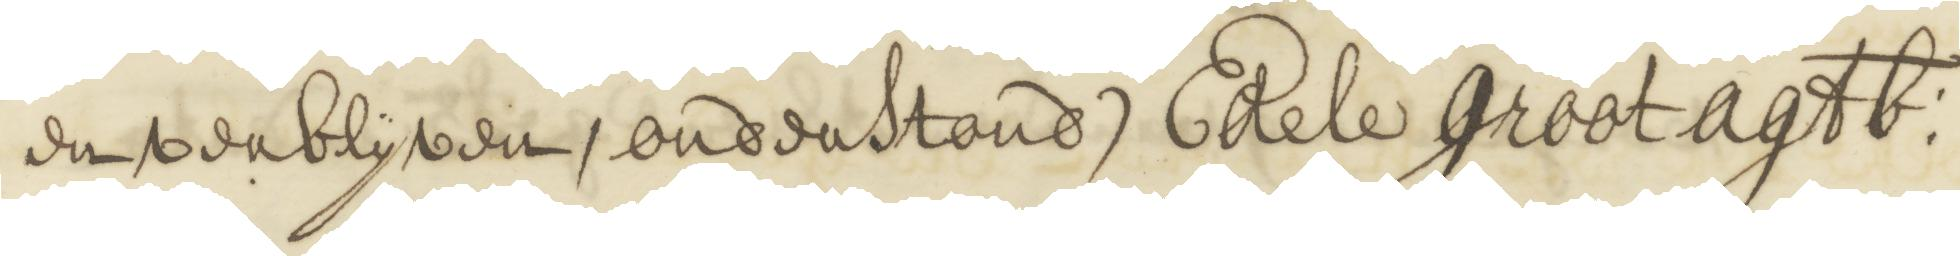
en verblijven, onderstond) Edele groot agtb:
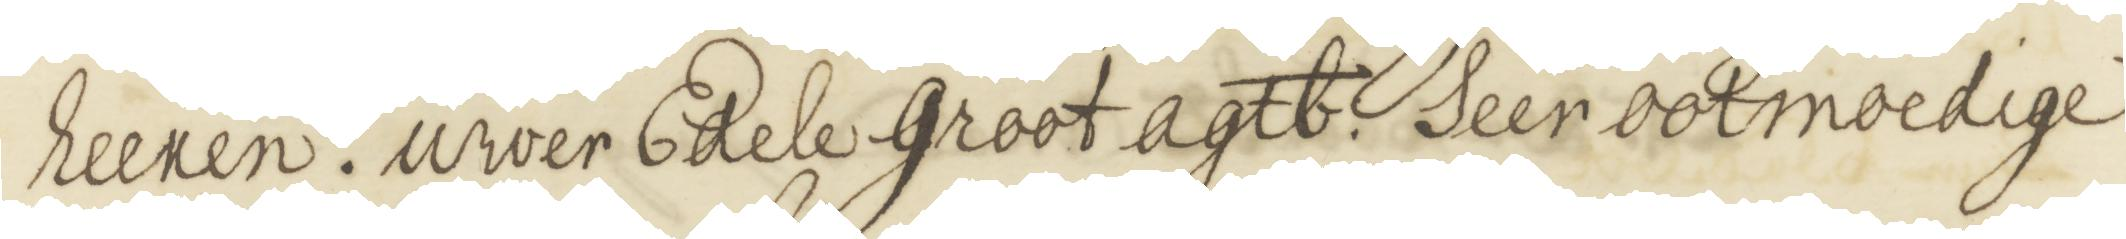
heeren! uwer Edele groot agtb: seer ootmoedige
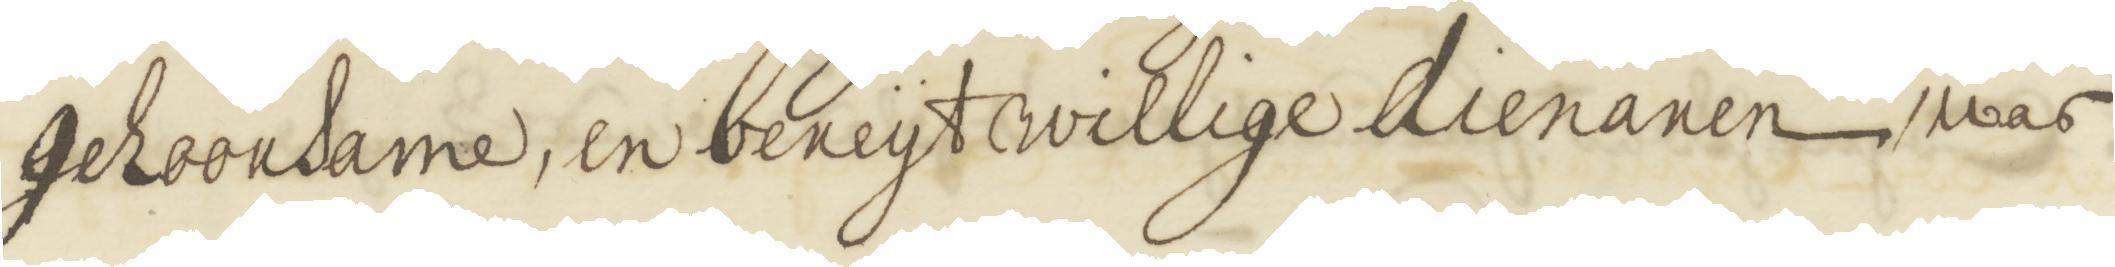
gehoorsame, en bereijtwillige dienaren, was
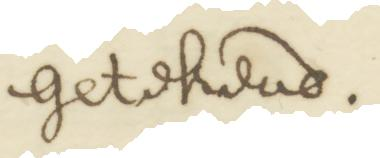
getekend.
